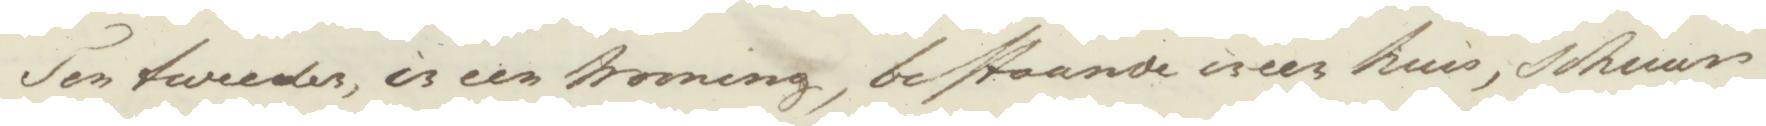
Ten tweeden, in een Wooning, bestaande in een huis, Schuur
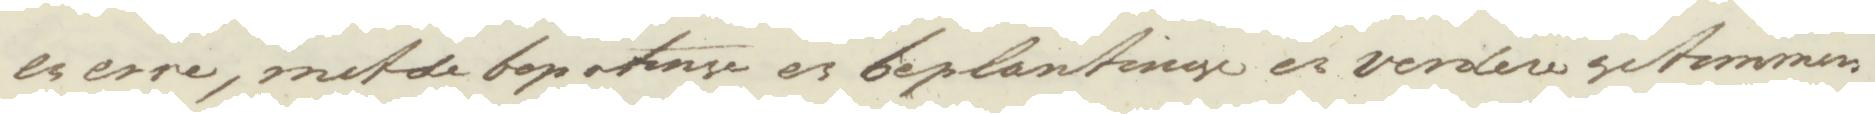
en erve, met de bepotinge en beplantinge en verdere getimmer
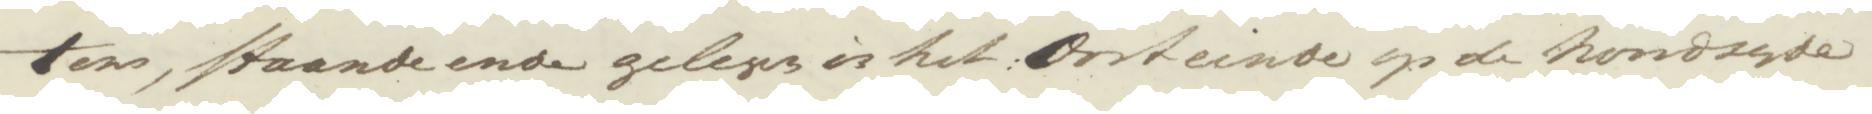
ten, staande ende gelegen is het Oosteinde op de Noordzyde
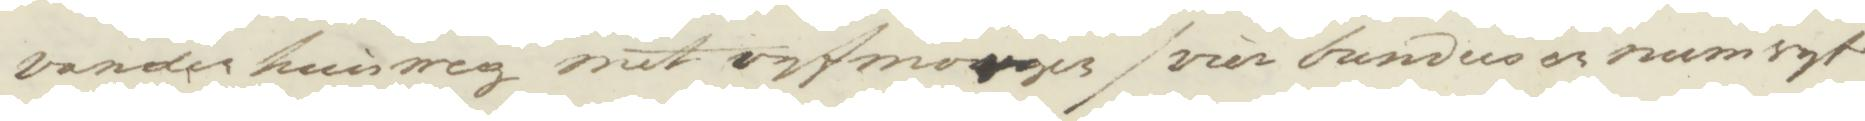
van den huisweg met vyf morgen / vier bunders en ruim vyf
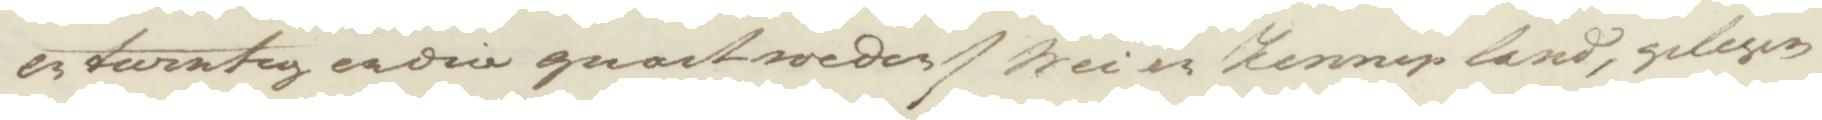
en twintig en drie quart roeden / Wei en hennip land, gelegen
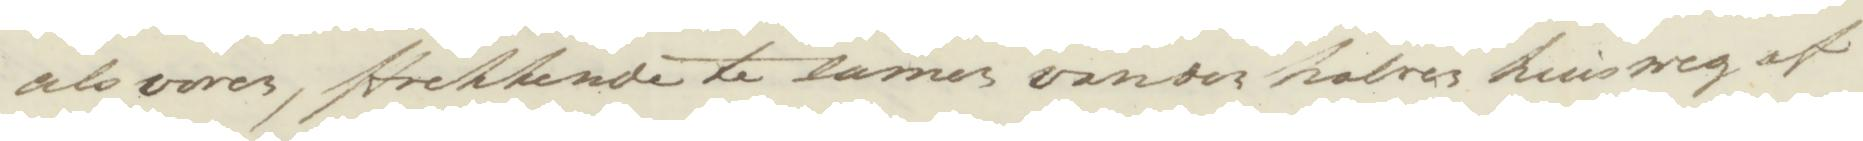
als voren, strekkende te zamen van den halven huisweg af
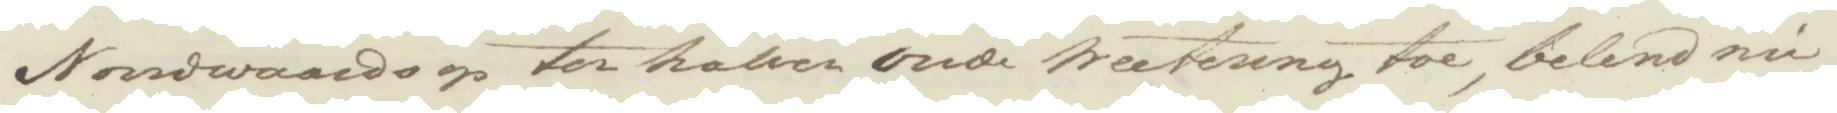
Noordwaards op ten halven oude Weetering toe, belend nu
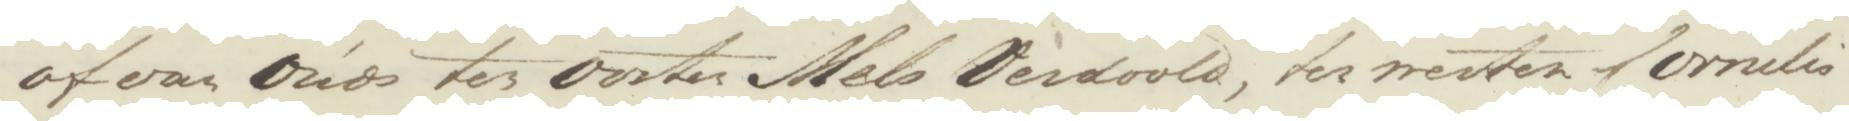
of van ouds ten Oosten Mels Verdoold, ter westen Cornelis
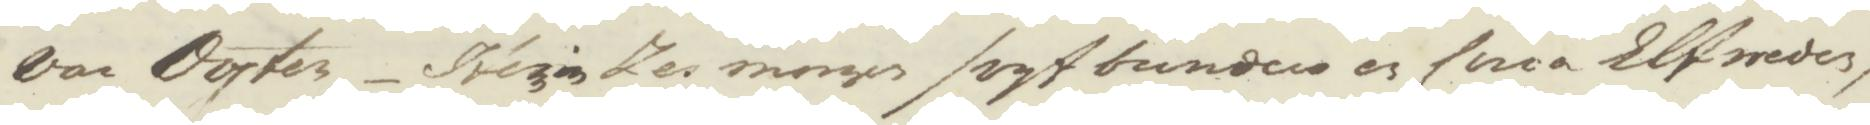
van Ogten — Item Zes morgen /vyf bunders en Circa Elf roeden /
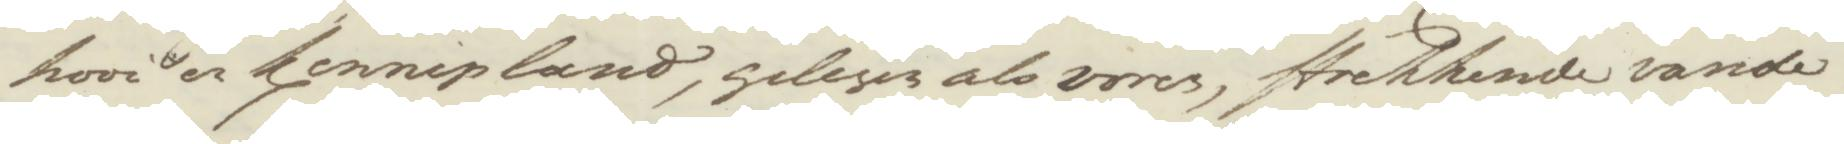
hooi en hennipland, gelegen als voren, strekkende van de
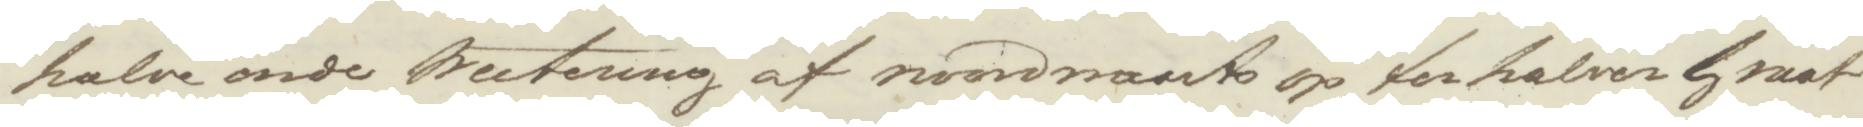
halve oude Weetering af noordwaarts op ten halven Graaf
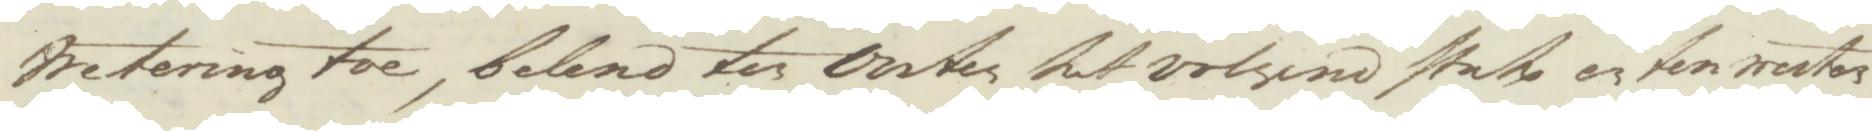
wetering toe, belend ten Oosten het volgend stuk en ten westen
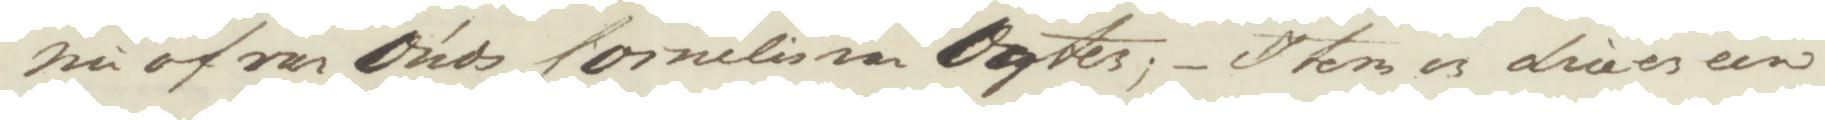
nu of van ouds Cornelis van Ogten; - Item in drie en een
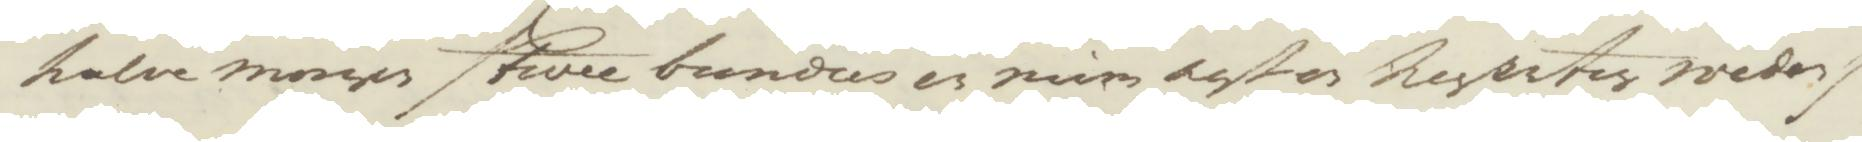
halve morgen / twee bunders en ruim agt en Zeventig roeden /
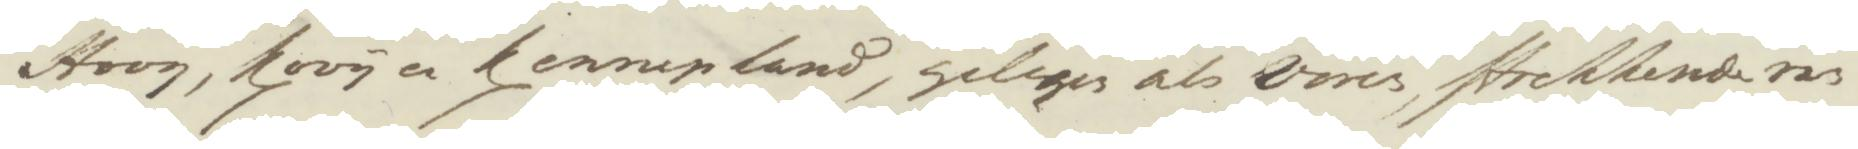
Hooy, Kooij en hennipland, gelegen als voren, Strekkende van
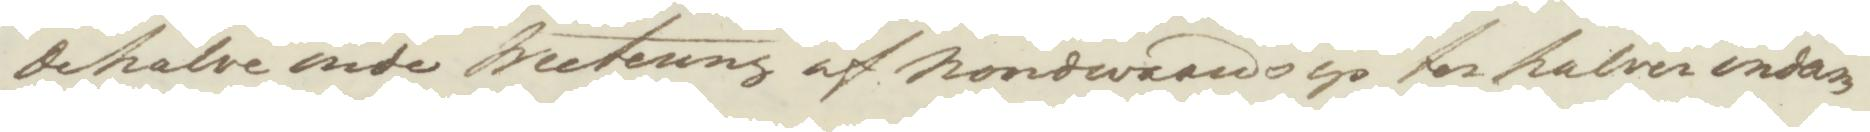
de halve oude Weetering af Noordwaards op ten halven indam
